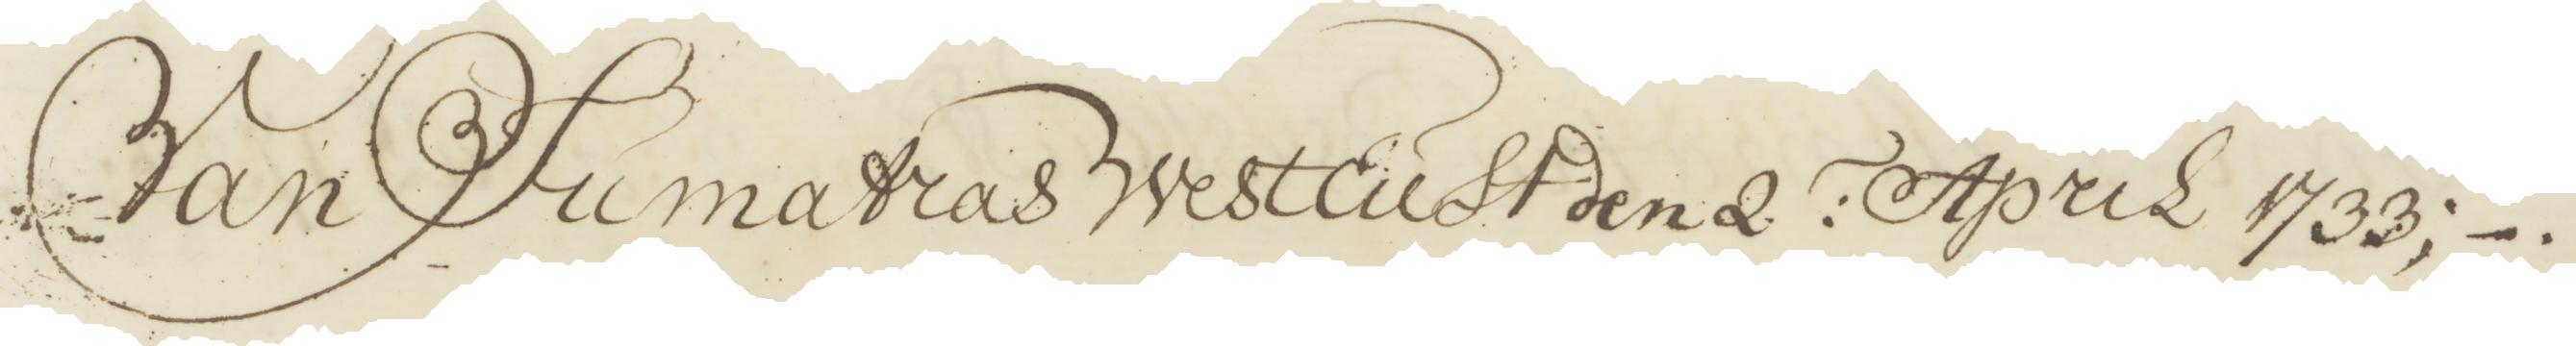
Van Sumatras Westcust den 2:' April 1733; —.
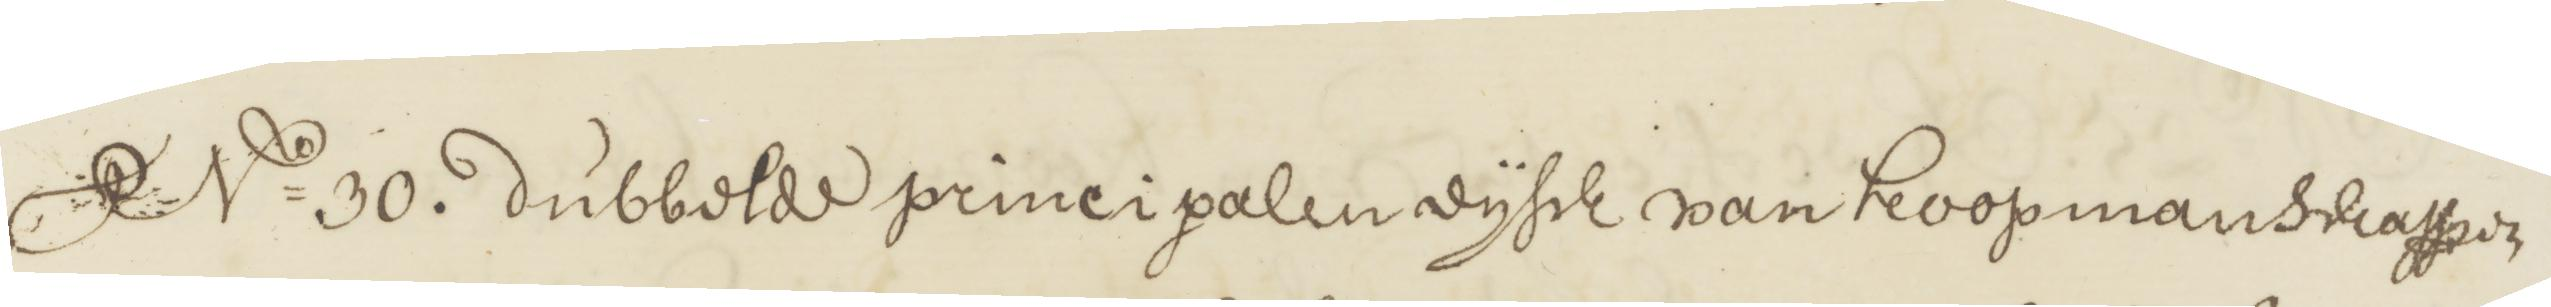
N=o 30. dubbelde principalen eijsch van koopmanschappen
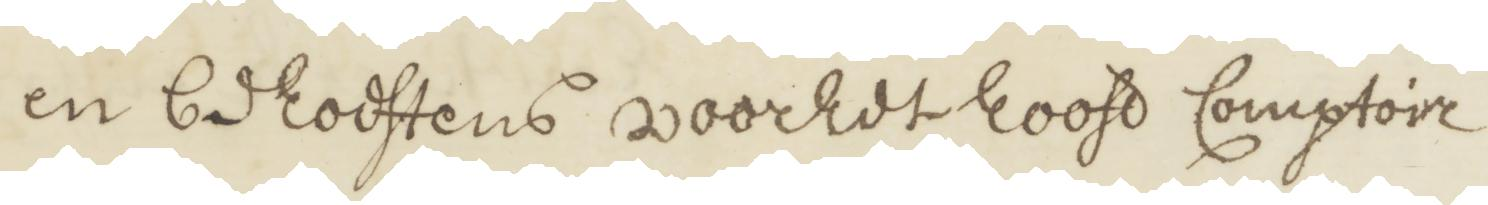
en behoeftens voor het hoofd Comptoir
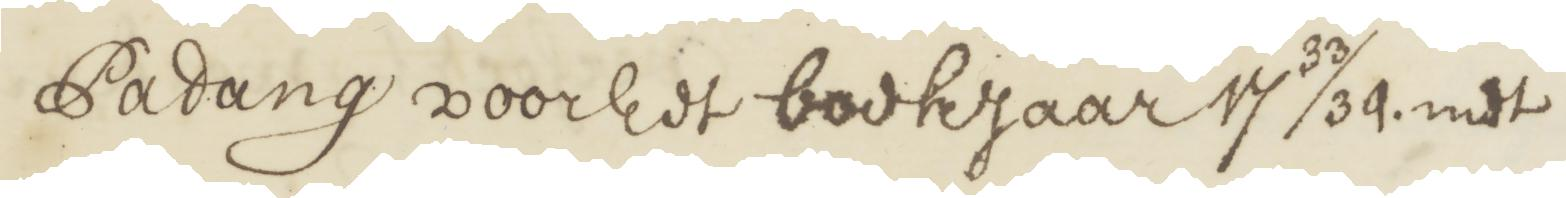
Padang voor het boekjaar 1733/34. met
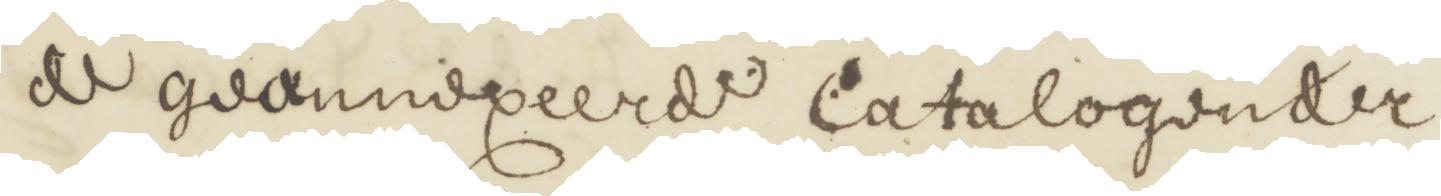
de geannexeerde Catalogen der
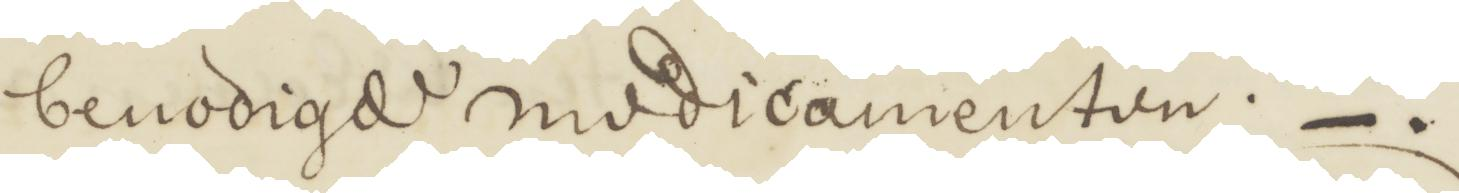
benodigde medicamenten; —.
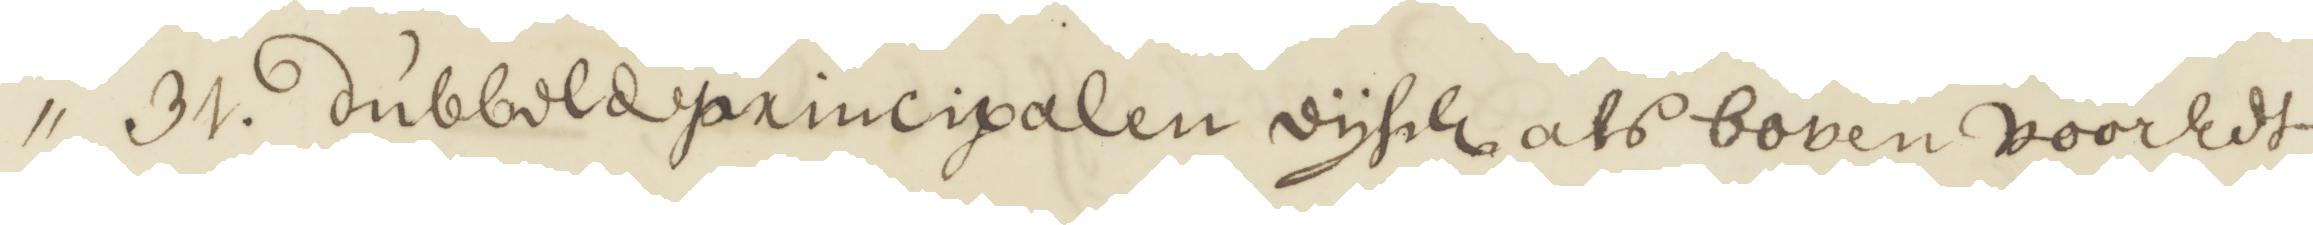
„ 31. dubbelde principalen eijsch als boven voor het
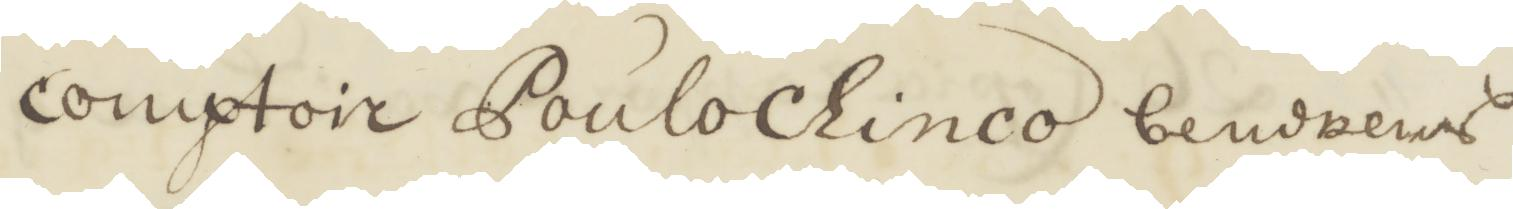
comptoir Poulo Chinco benevens
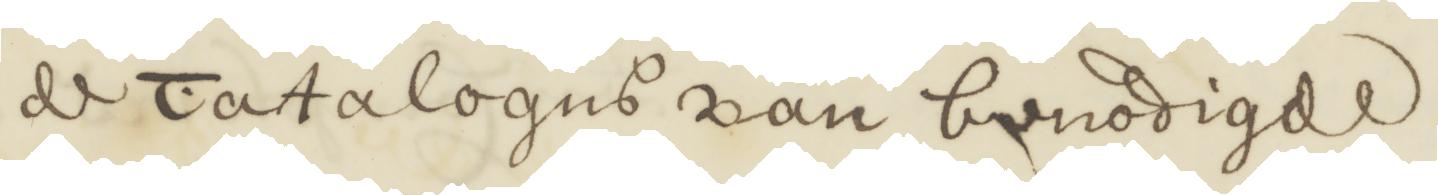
de catalogus van benodigde
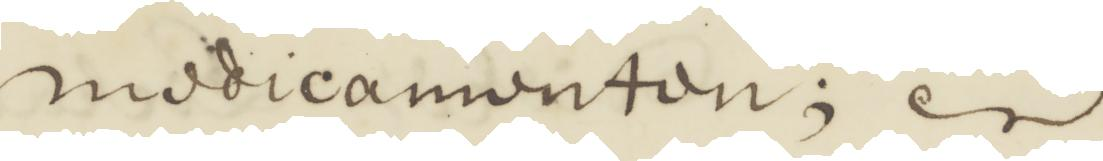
medicamenten; et
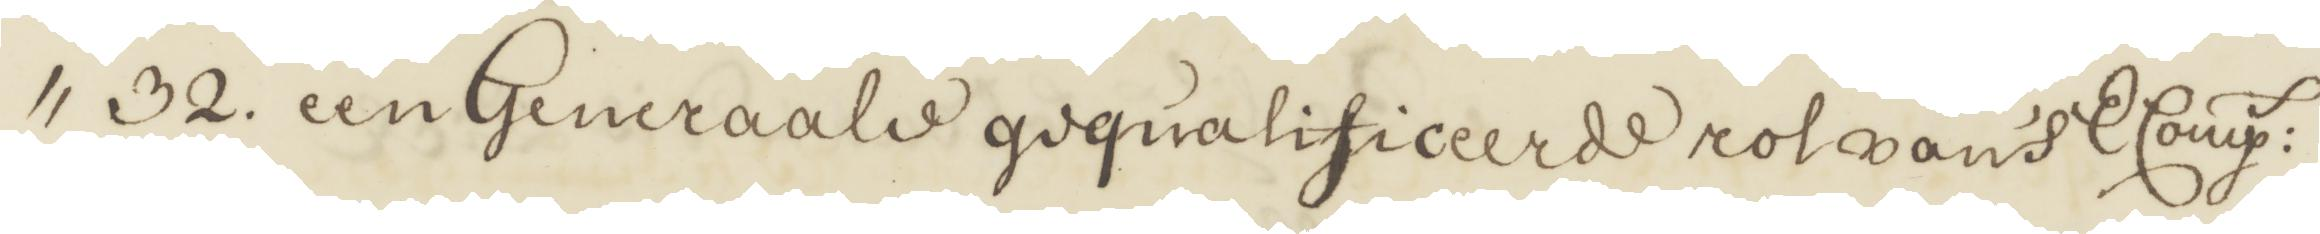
„ 32. een Generaale gequalificeerde rol van ’s E Comp:s
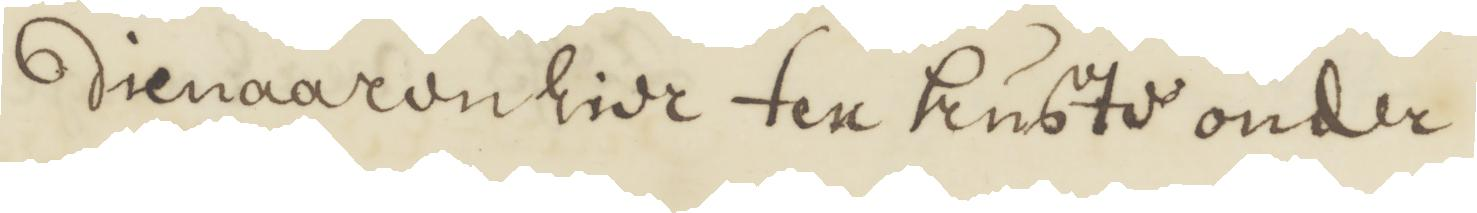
dienaaren hier ter kuste onder
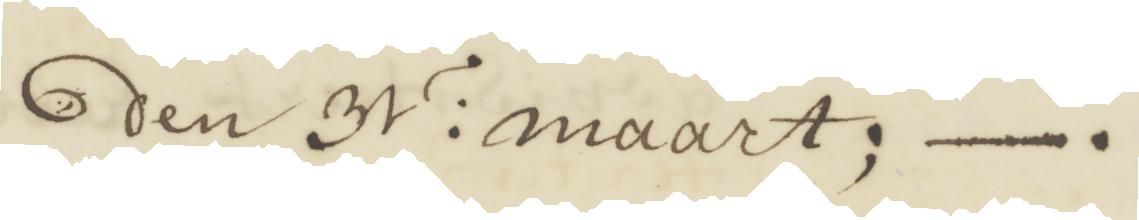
den 31:' maart; —.
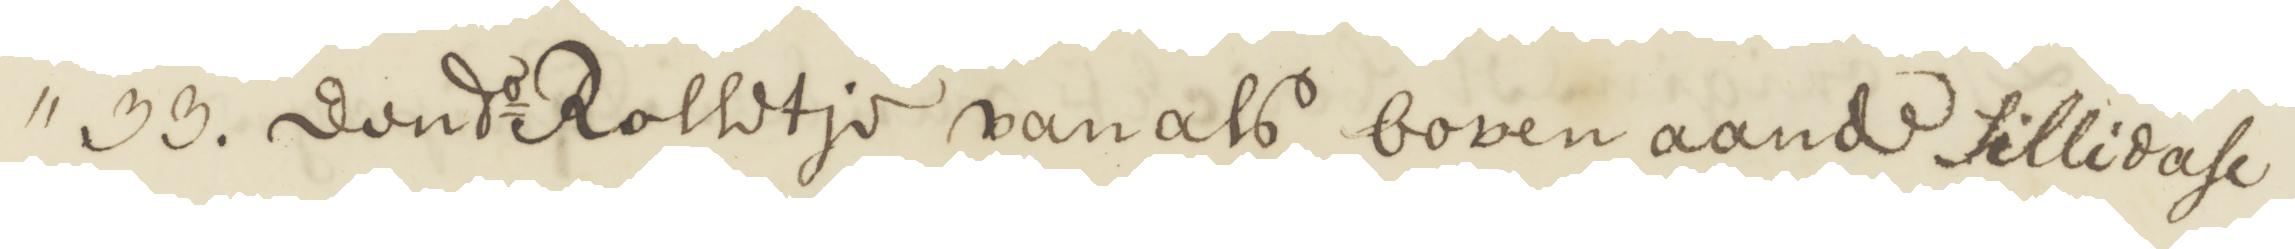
„ 33. Een d=o Rolletje van als boven aande Sillidase
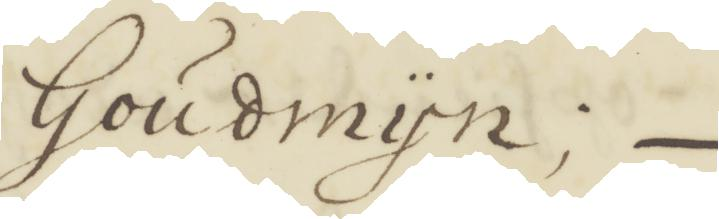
Goudmijn; —
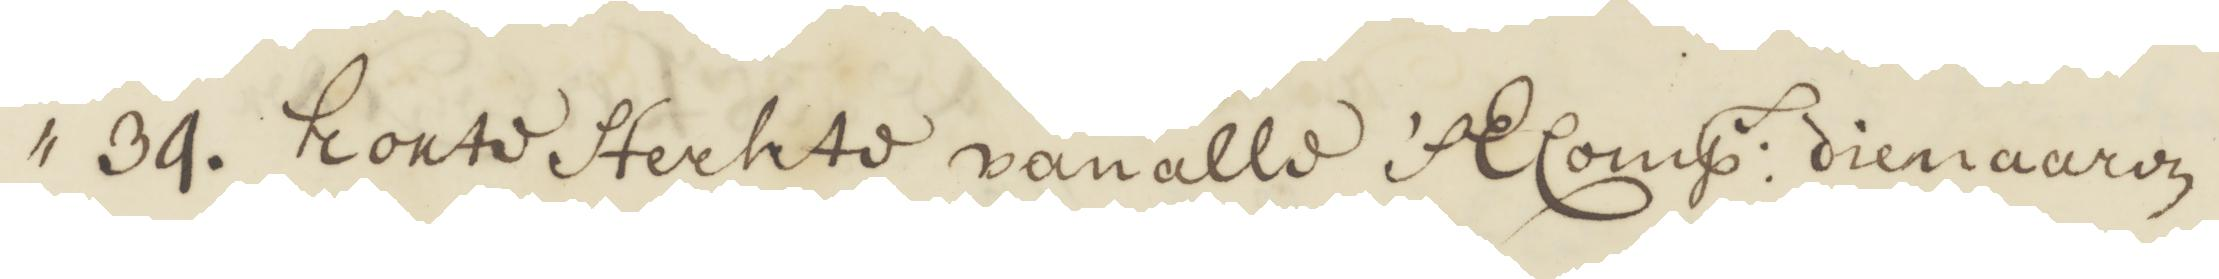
„ 34. korte sterkte van alle 's E Comp:s dienaaren
